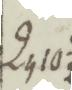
2„10
